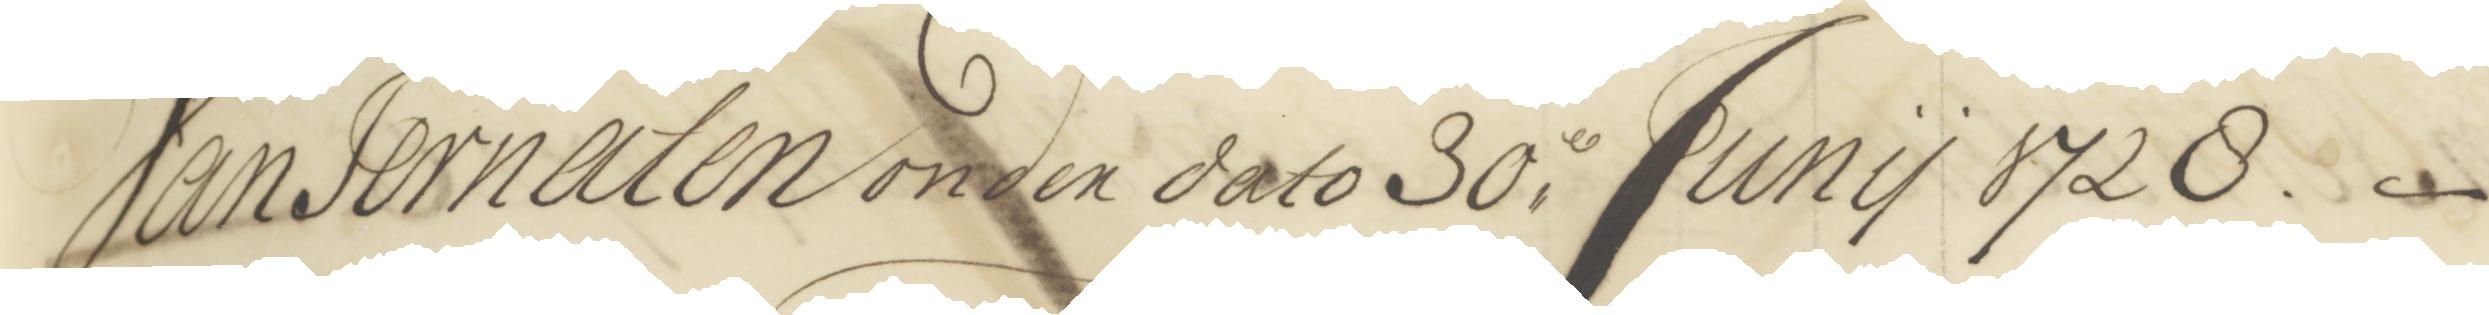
Van Ternaten onder dato 30„e Junij 1728. -
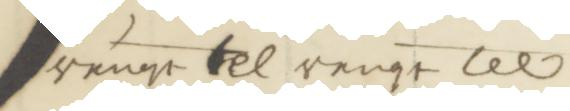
vrugt tel vrugt tel
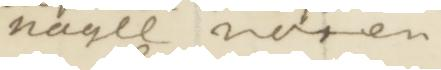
nagel noten
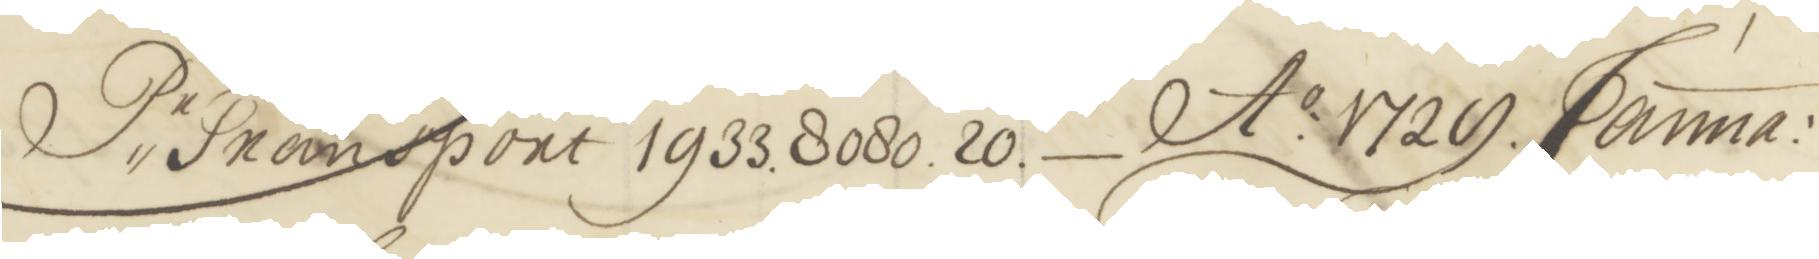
P„r Transport 1933.8080.20. — A:o 1728. Janua:
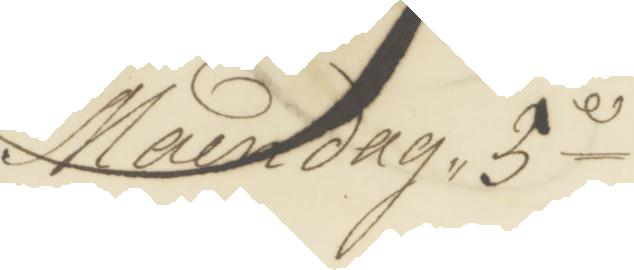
Maendag„ 3=e
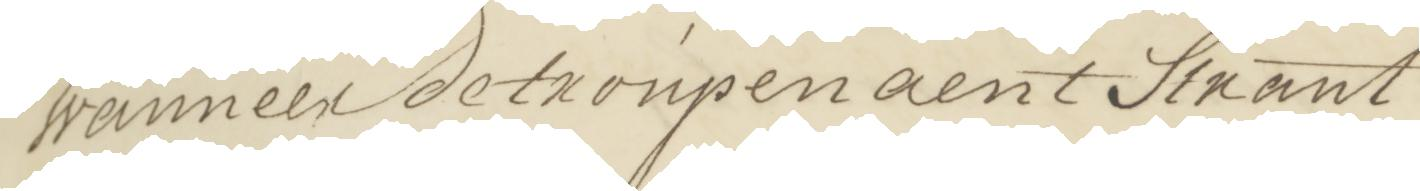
wanneer de troupen aen 't Strant
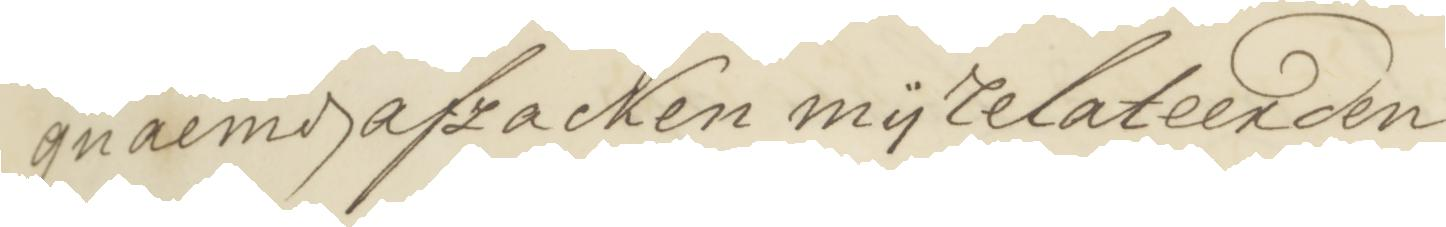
quaemen afzacken mij relateerden
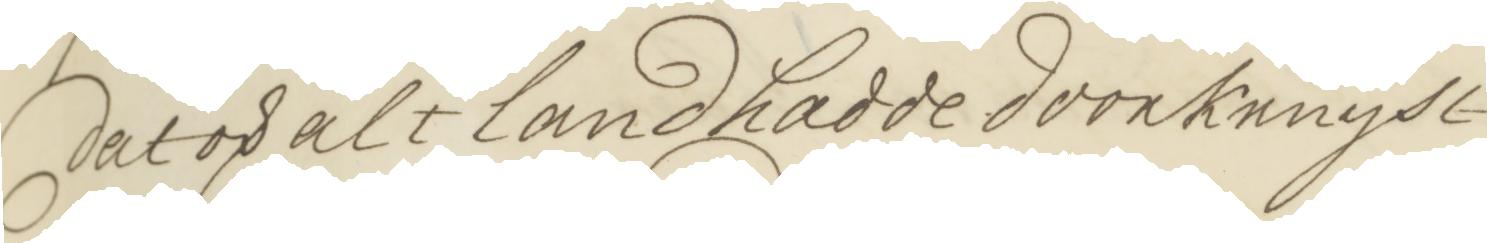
dat over al t' land hadde doorkruijst
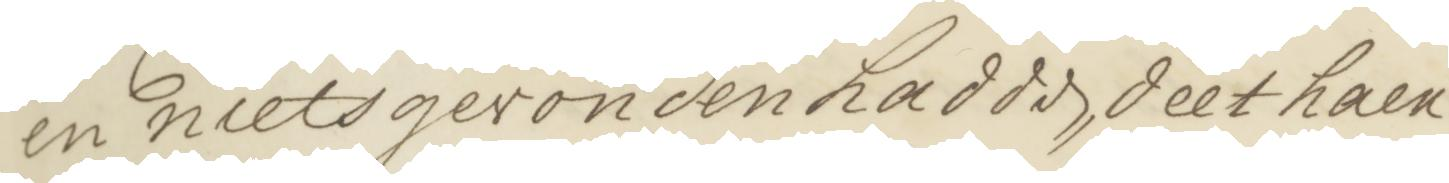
en niets gevonden hadden, deet haer
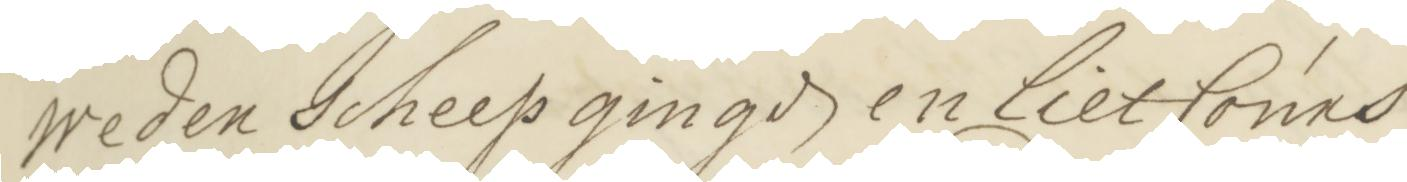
weder scheep gingen en liet cours
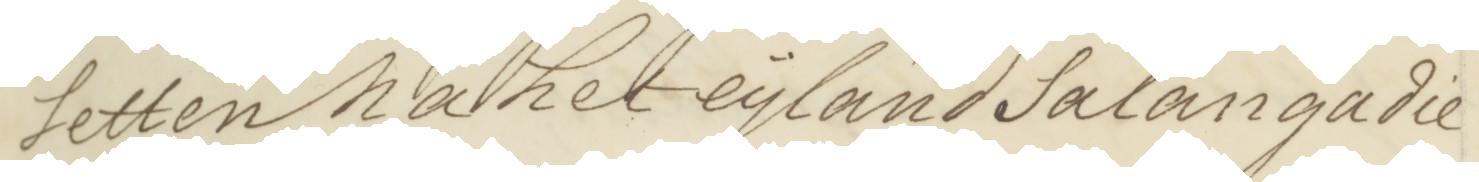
Setten na het eijland Salangadie
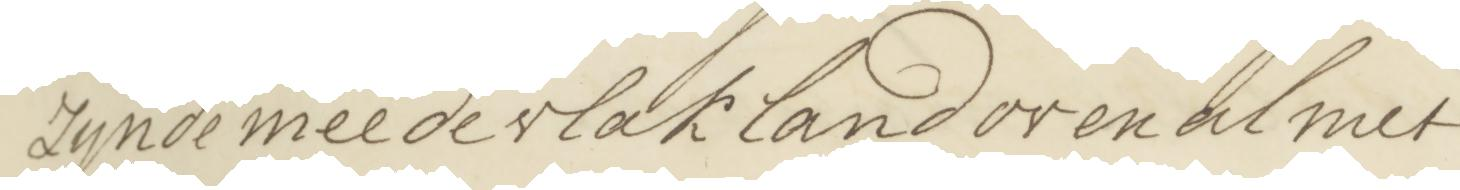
zynde meede vlakland over al met
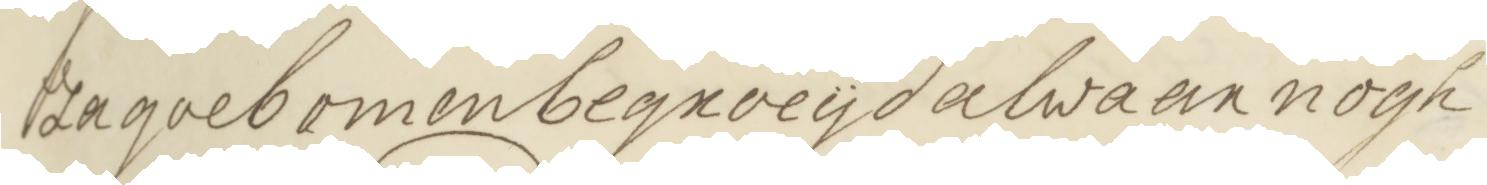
zagoebomen begroeijd alwaar nogh
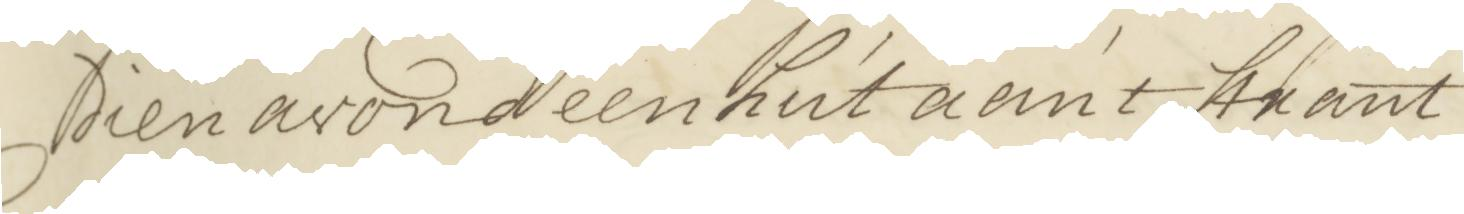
dien avond een hut aan ’t strant
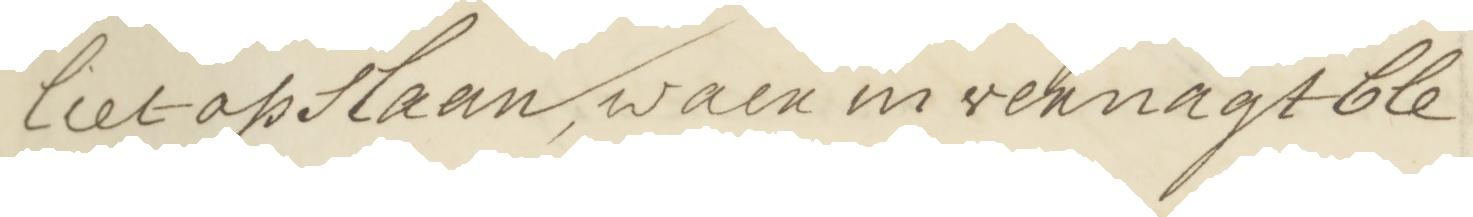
liet opslaan, waer in vernagt ble
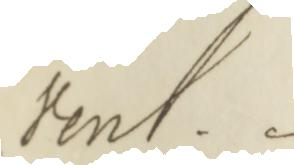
ven. ~
